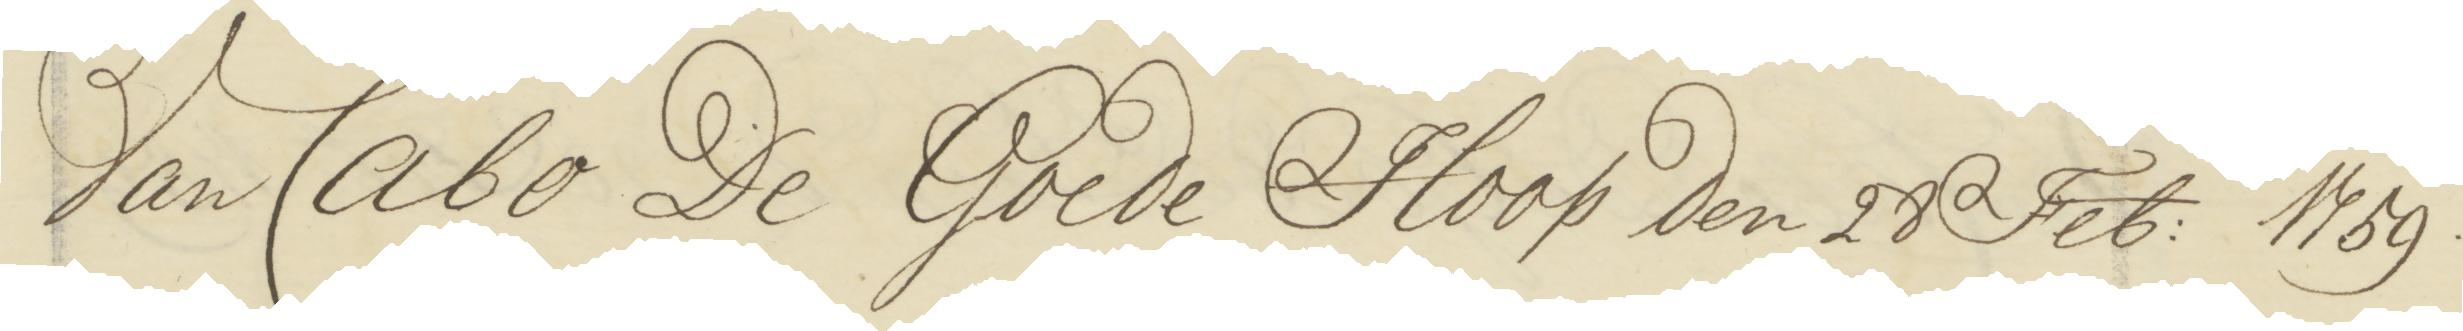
Van Cabo De Goede Hoop den 28 Feb: 1759
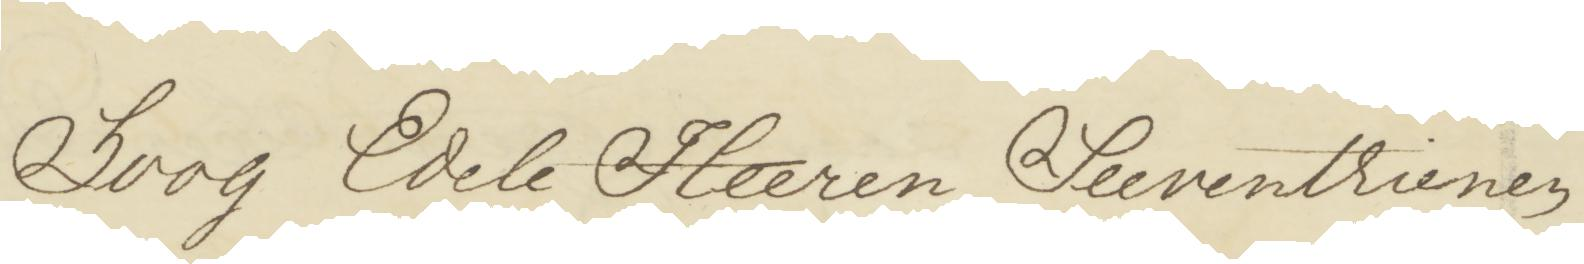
Hoog Edele Heeren Seeventhienen
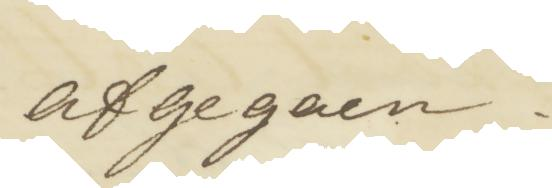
afgegaen
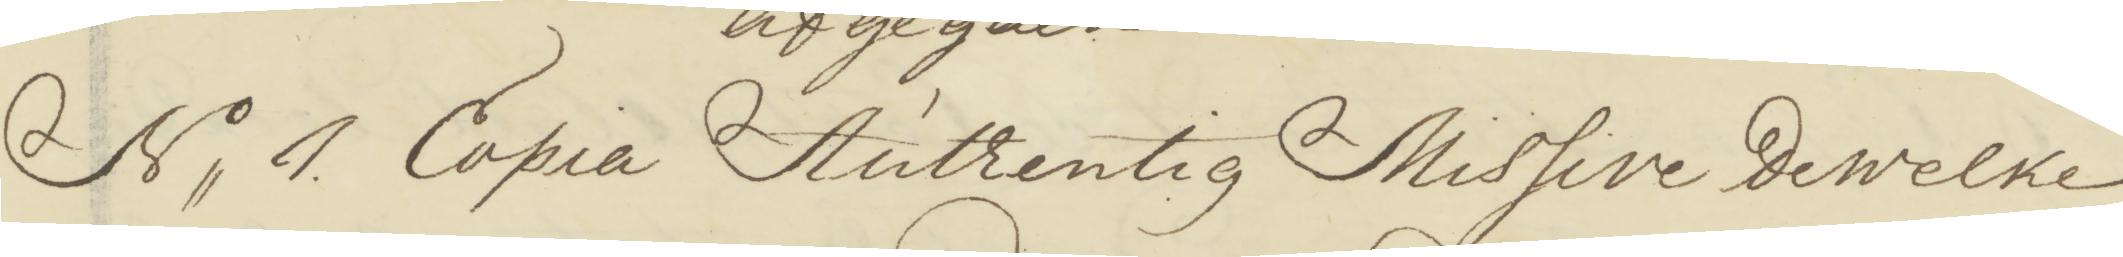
N„o 4. Copia Authentiq Missive dewelke
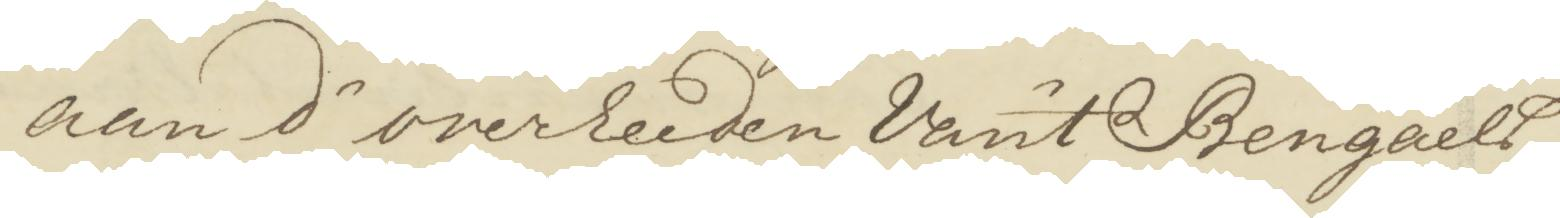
aan d’ overheeden van’t Bengaels
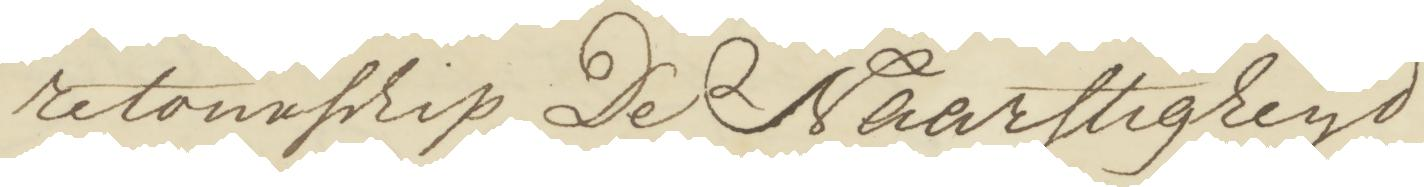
retourschip De Naarstigheijd
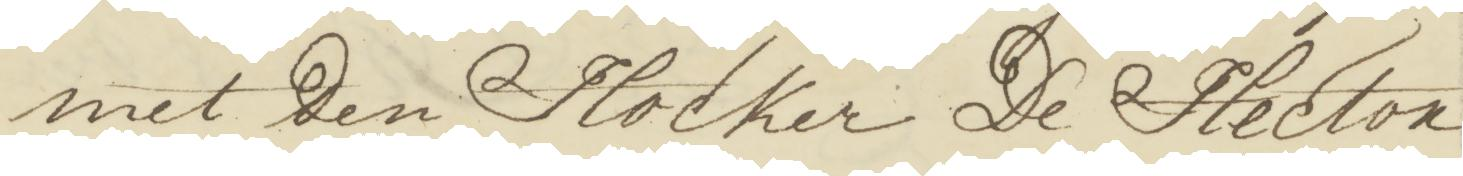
met den Hocker De Hector
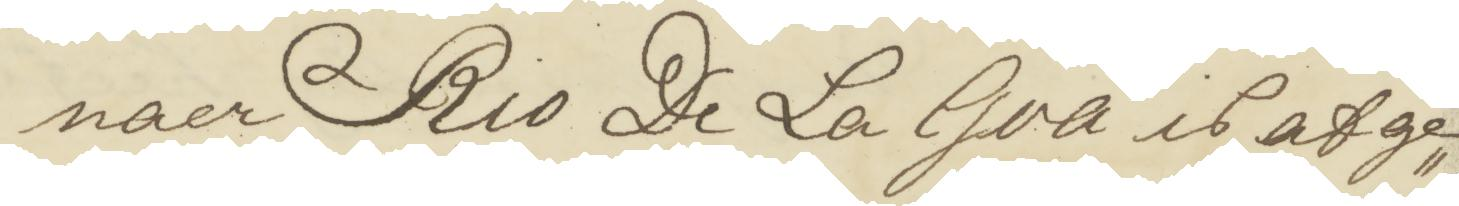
naer Rio De La Goa is afge„
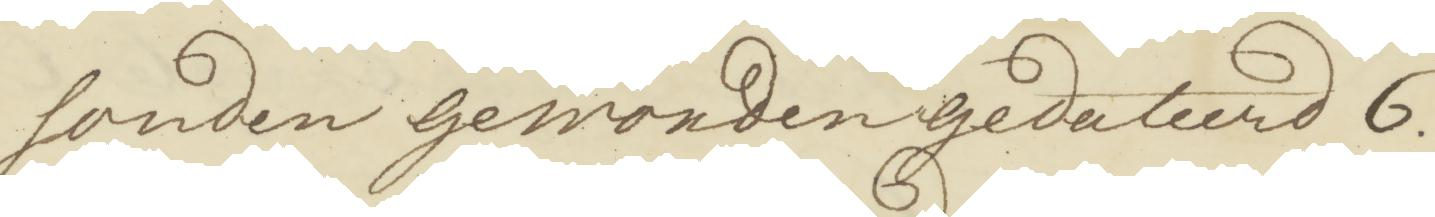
sonden geworden gedateerd 6.
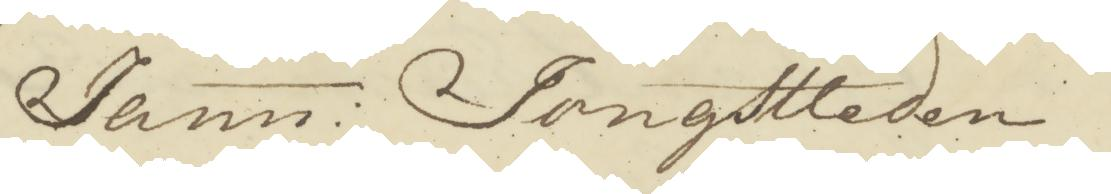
Iann: Iongstleden
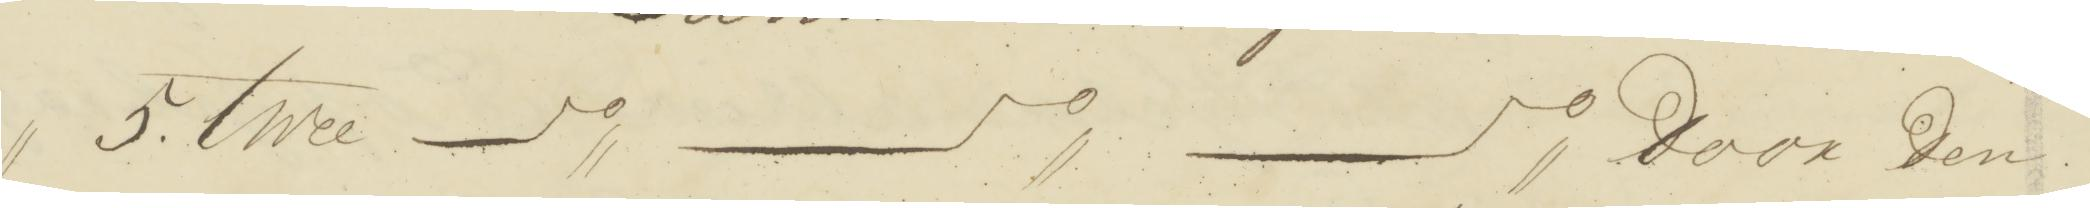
„ 5. twee _„o _„o _„o door den
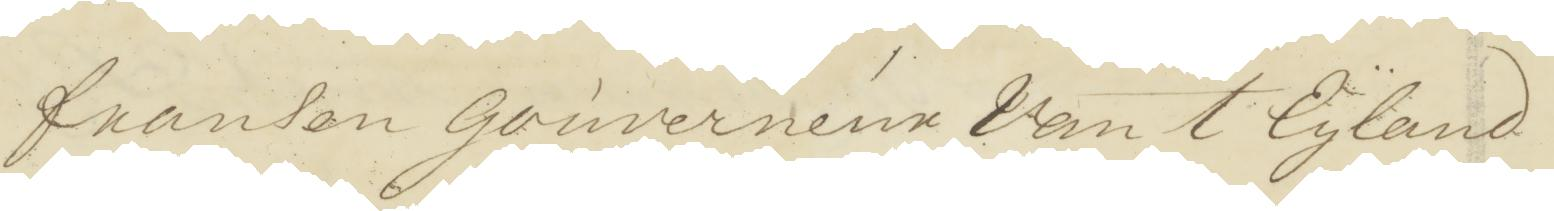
fransen gouverneur van t Eijland
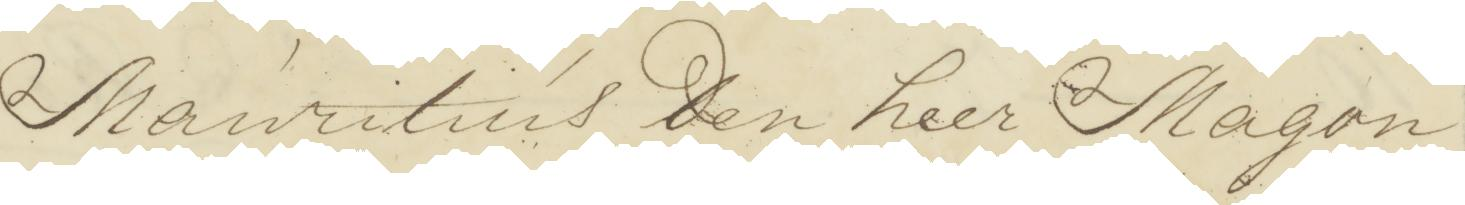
Mauritius den heer Magon
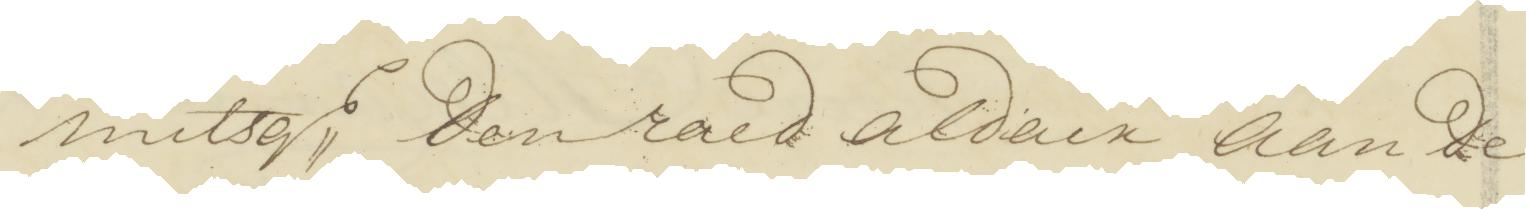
mitsg„s den raed aldair aan de
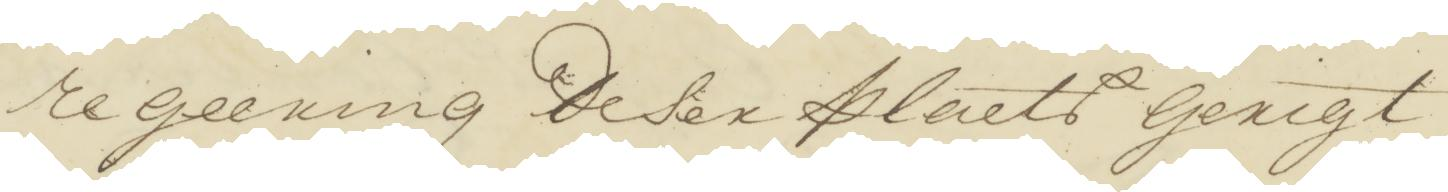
regeering deser plaets gerigt
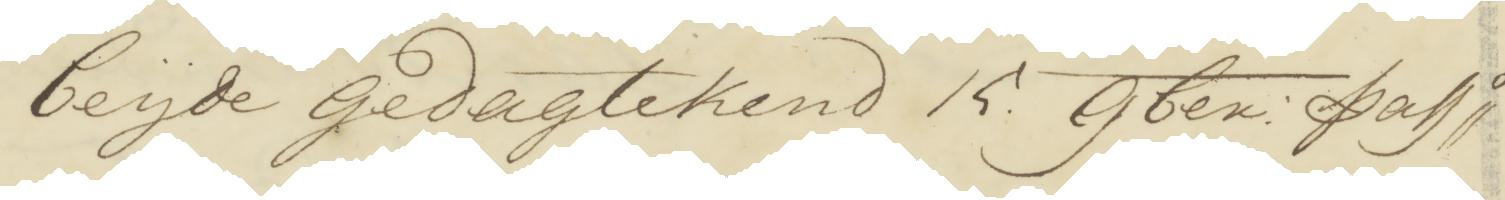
beijde gedagtekend 15. 9ber: pass„o
